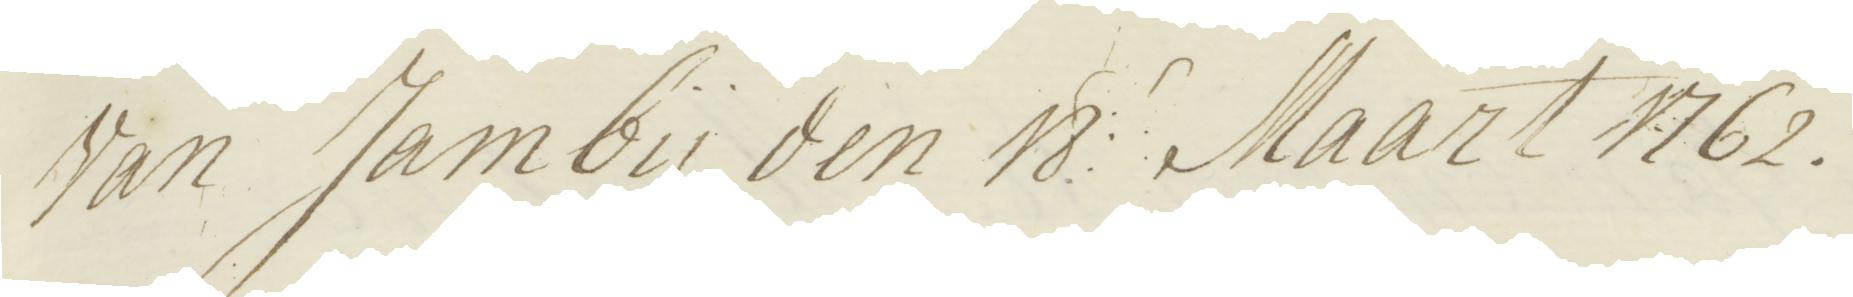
Van Jambij den 18:' Maart 1762.
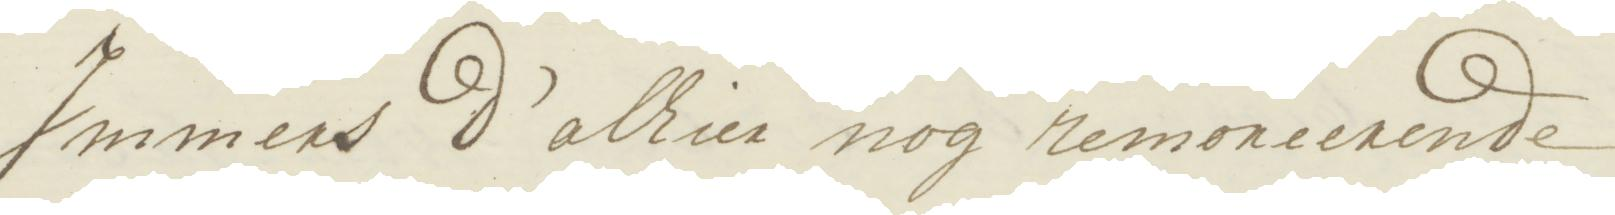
Immers d’ alhier nog remoreerende
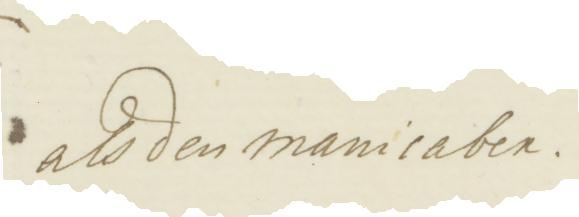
als den manicaber.
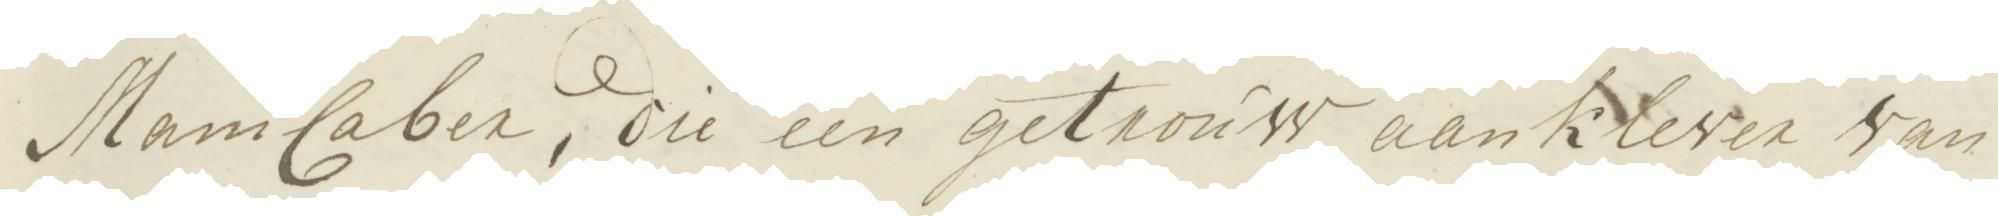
Manicaber, die een getrouw aan klever van
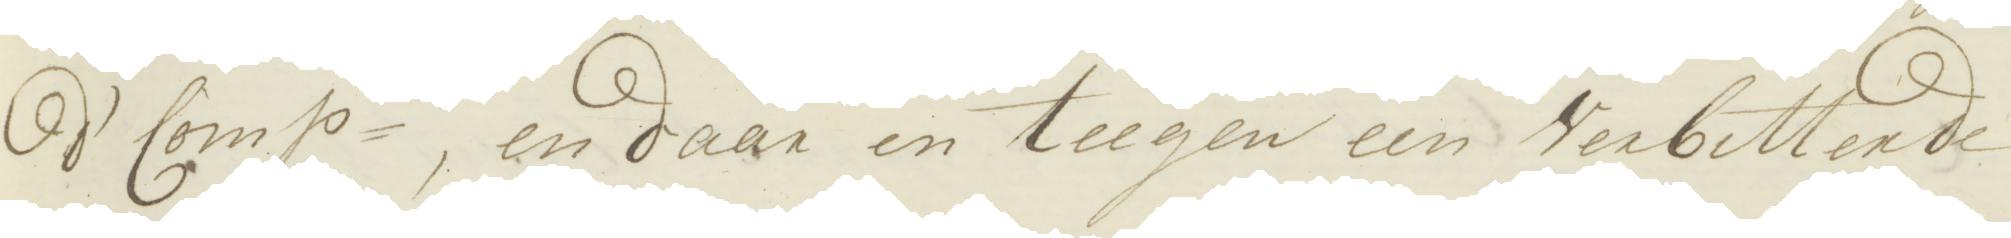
d' Comp=e, en daar en teegen een verbitterde
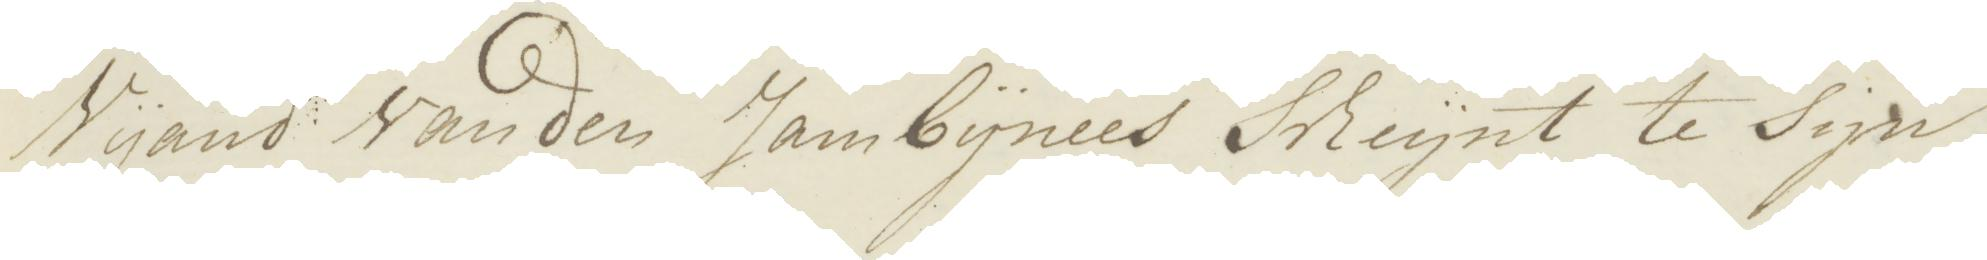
vijand van den Jambijnees Scheijnt te sijn,
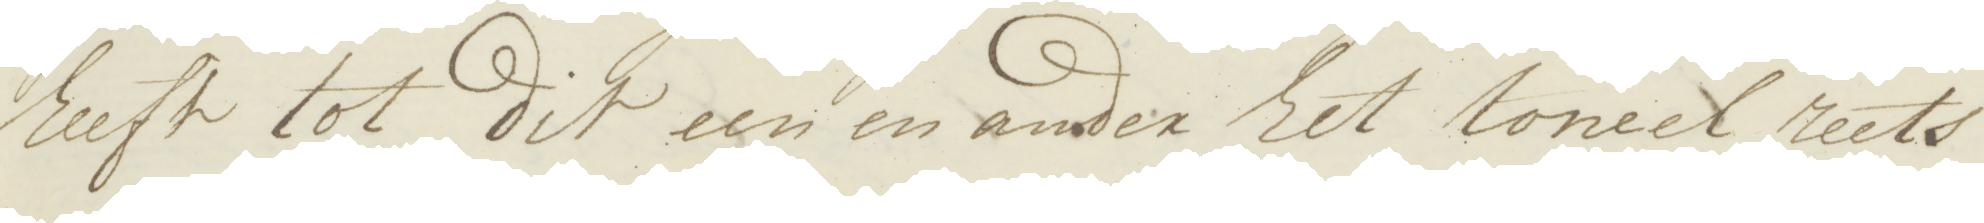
heeft tot dit een en ander het toneel reets
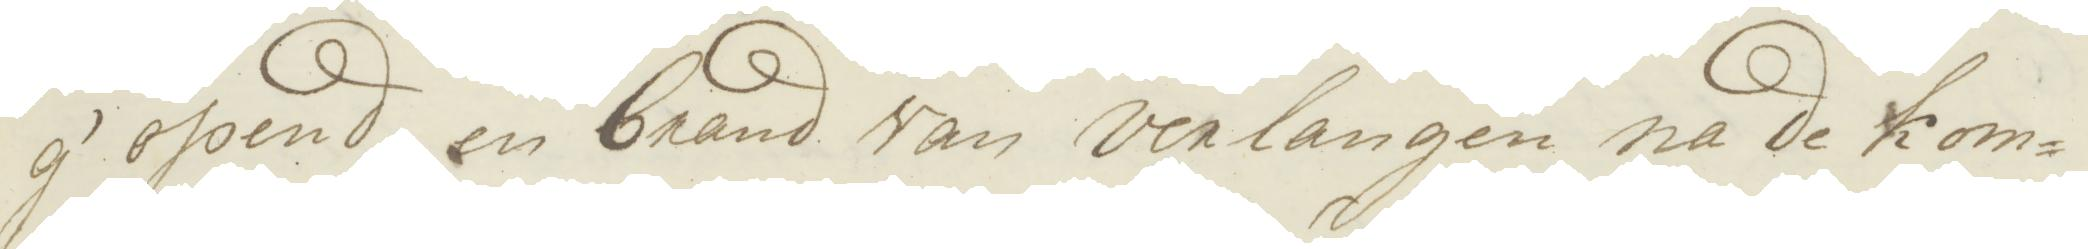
g’ opend, en brand van verlangen na de kom=
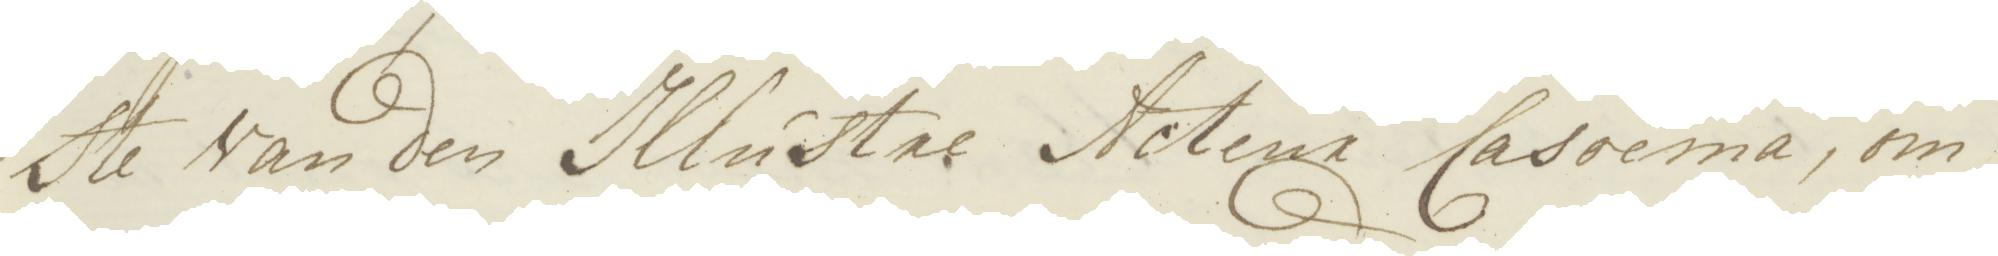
ste van den Ilustre Acteur Casoema, om
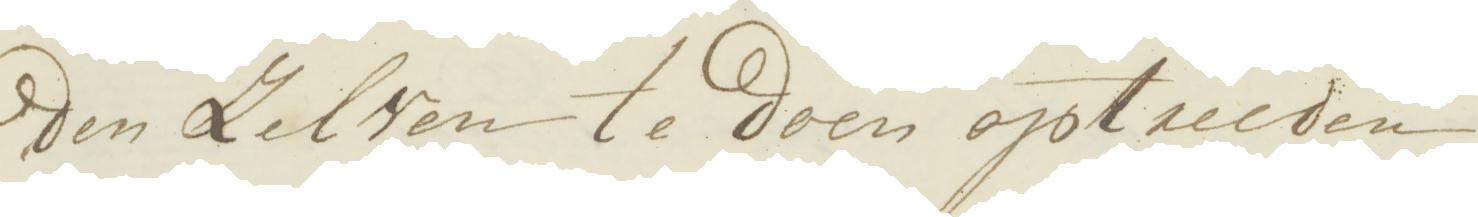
den zelven te doen optreeden
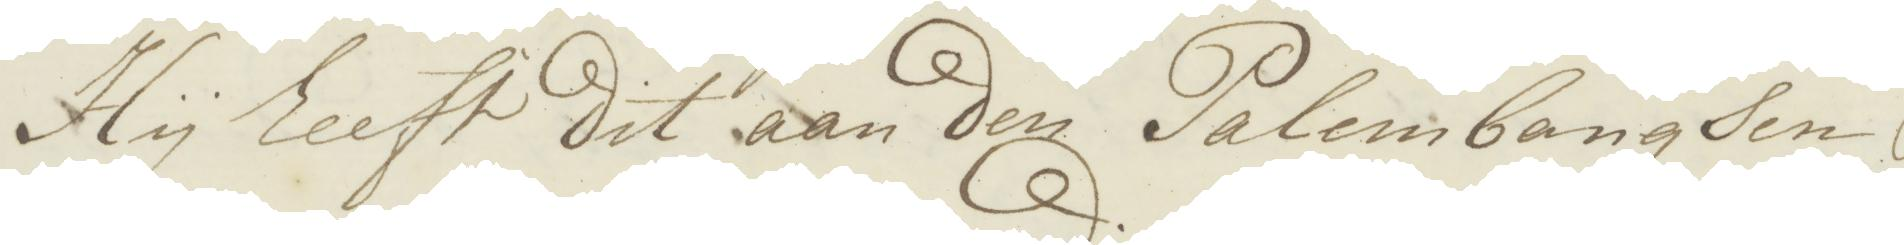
Hij heeft dit aan den Palembangsen
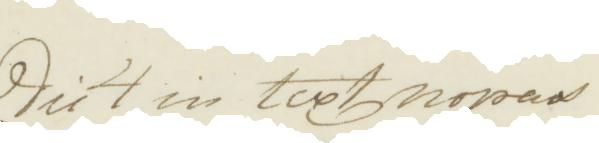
die 4 in text nopens
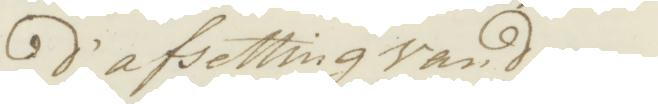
d’afsetting van desen
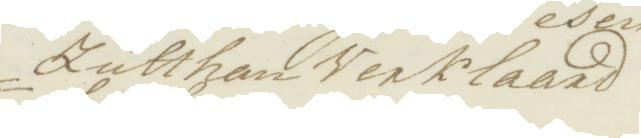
zulthan verklaard
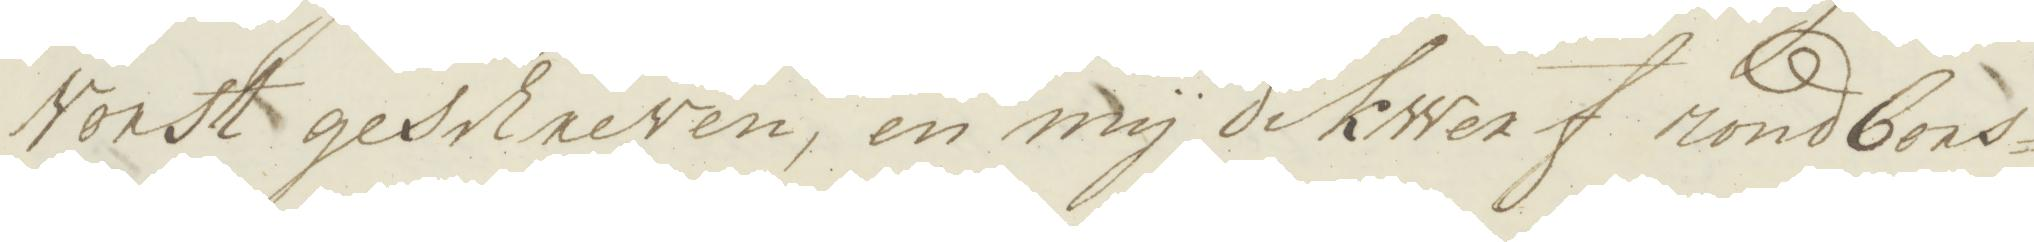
vorst geschreven, en mij dikwerf rondbors=
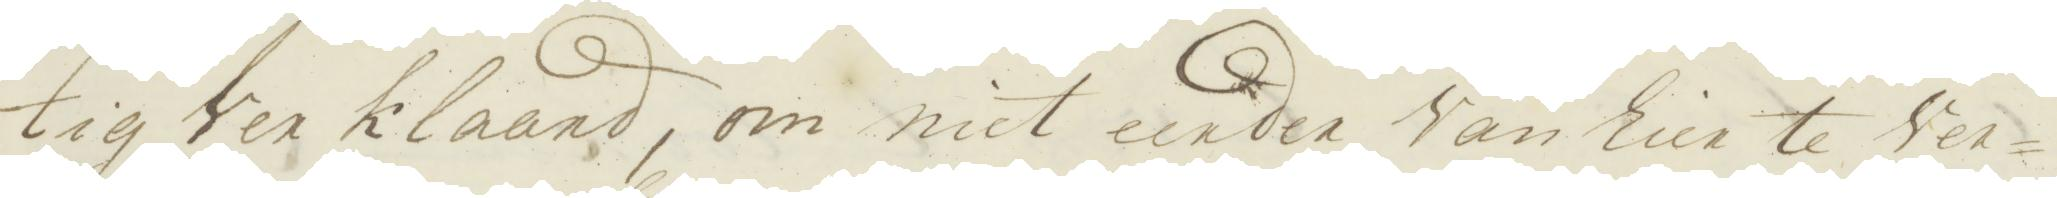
tig verklaard, om niet eerder van hier te ver=
